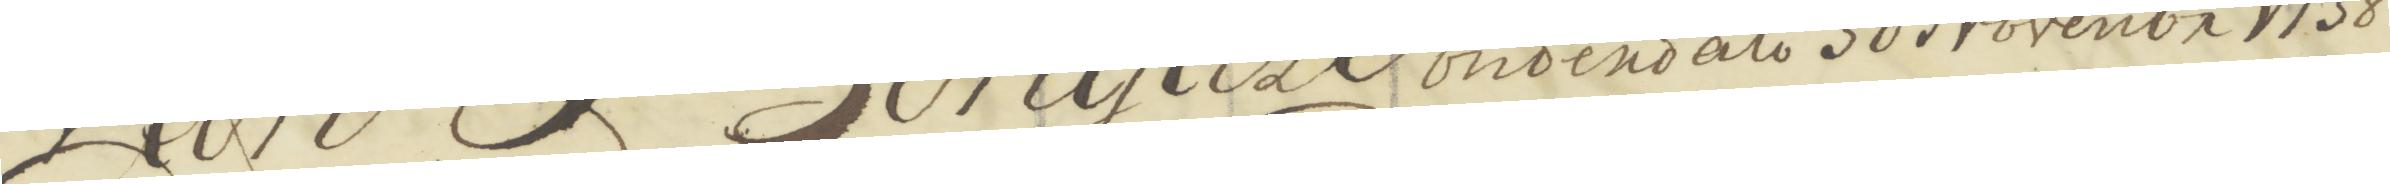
Van Bengale onderdato 30 Novembr 1738
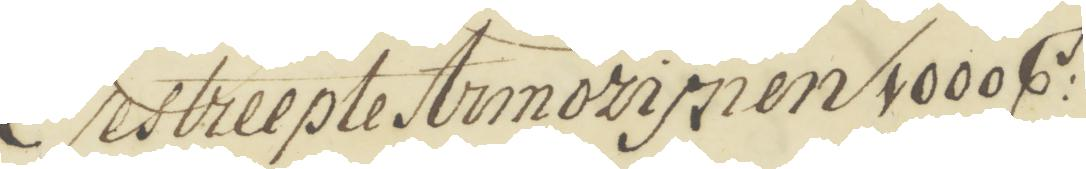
Gestreepte Armozijnen 1000 p:s
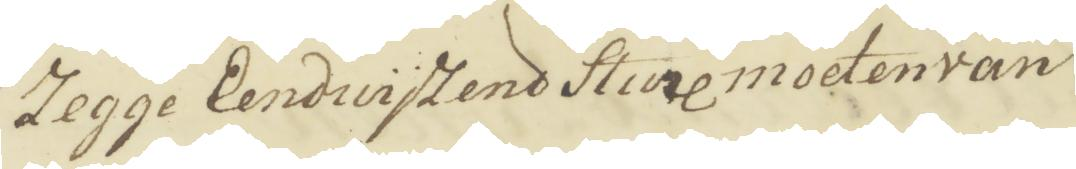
zegge Eenduijzend stux moeten van
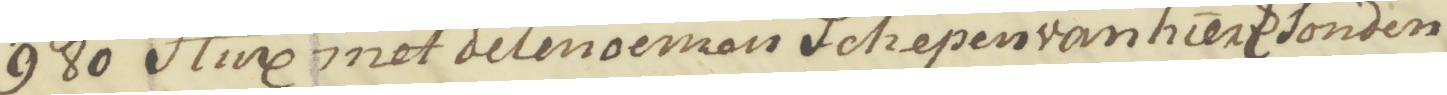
9 80 Stux met detenoemen schepen van hier versonden
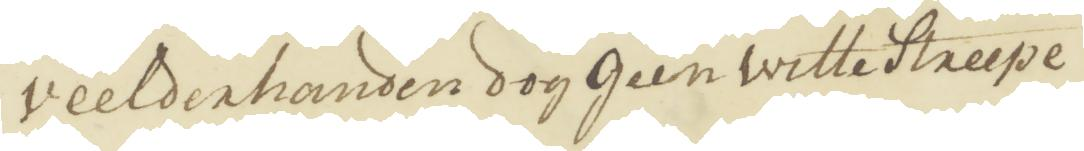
veelderhanden dog geen witte streepe
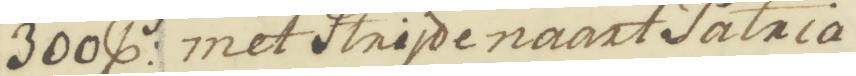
300 p:s met Strijde naart Patria
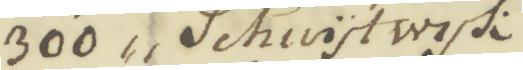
300 „ Schuijtwyk.
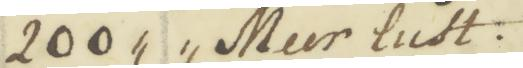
200„ „Meer lust.
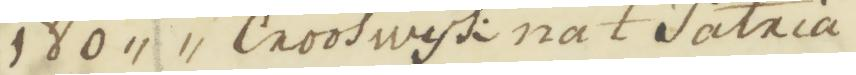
180„ „ Crooswyk na t Patria
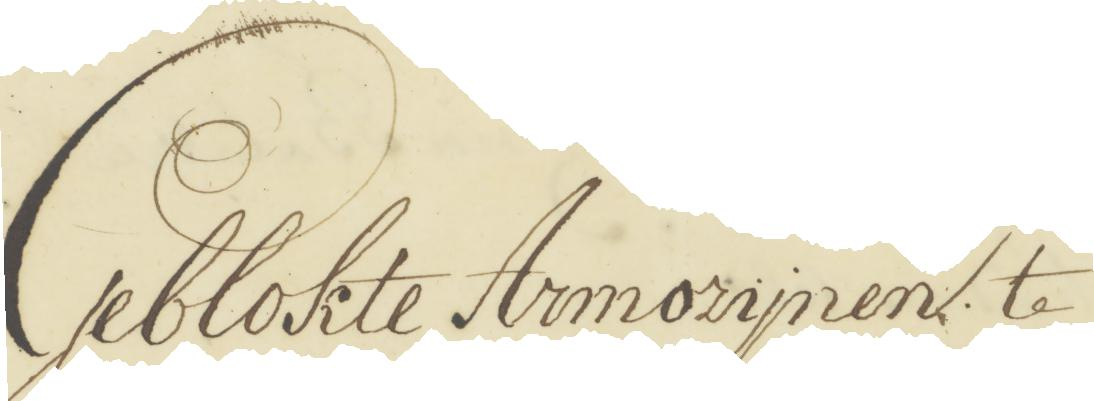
Geblokte Armozijnen te
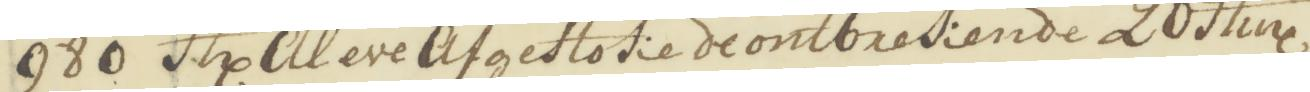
980 Stx Al eve Afgestoke de ontbrekende 20 Stux
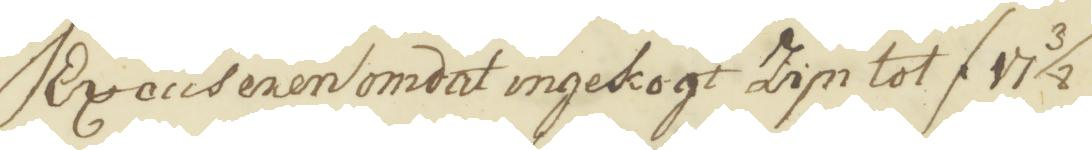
Excuseren omdat ingekogt zijn tot ƒ 17 3/8
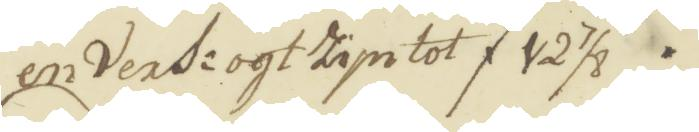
en Verkogt zijn tot ƒ 12 7/8.
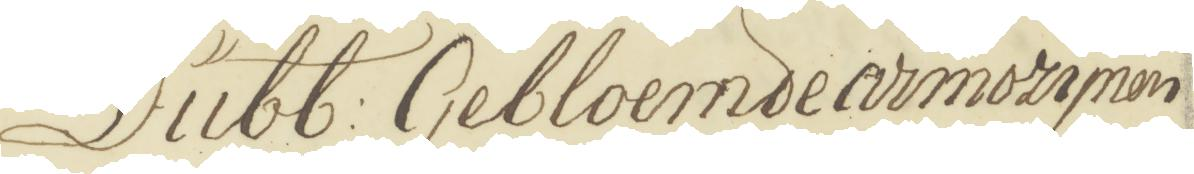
Dubb: Gebloemde armozijnen
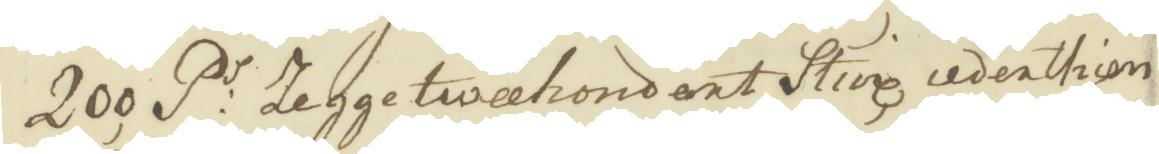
200 P:s zegge tweehondert stux iederthien
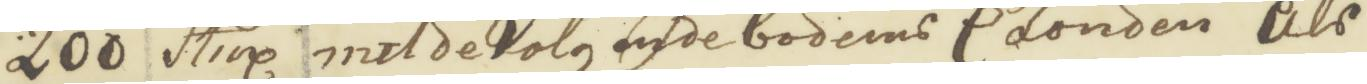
200 Stux met de Volg ende bodems verzonden als
